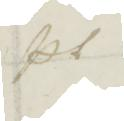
p.s
